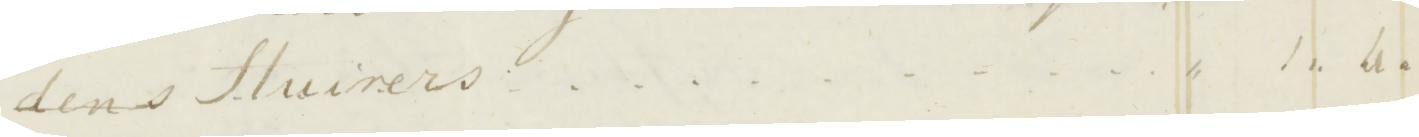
dens Stuivers . . . . . . . . . . „ 1„ 4
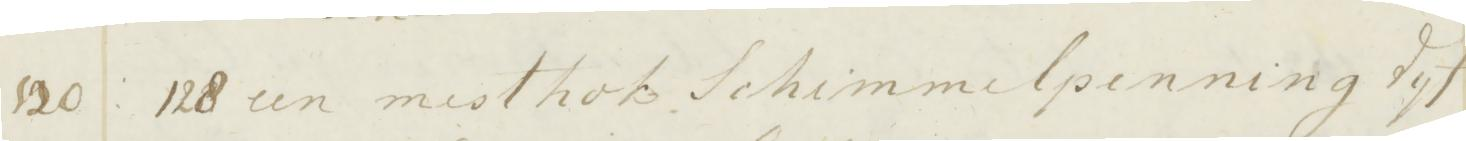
120 : 128 een mesthok schimmelpenning Vyf
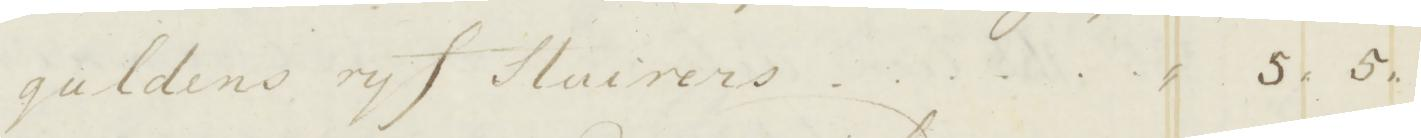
guldens vyf stuivers . . . . . . „ 5„ 5„
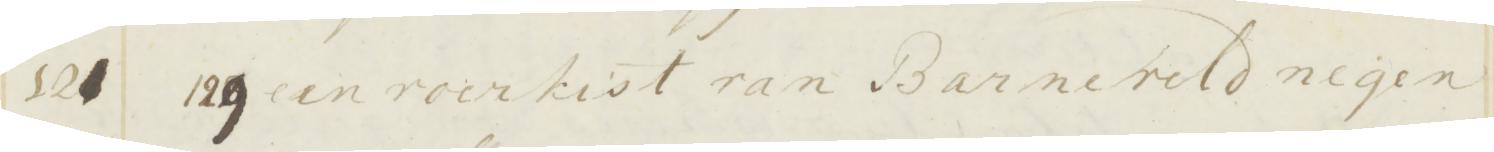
121 129 een veerkist van Barneveld negen
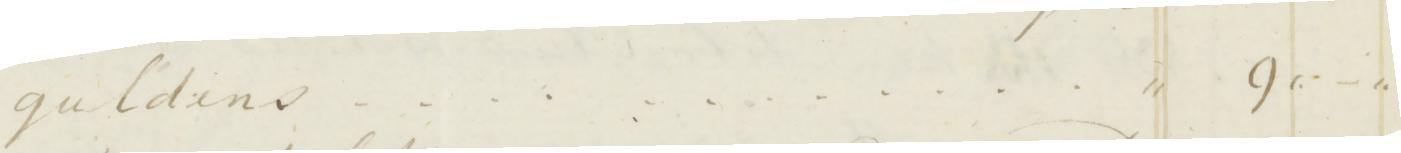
guldens . . . . . . . . . . . . . „ 9„ — „
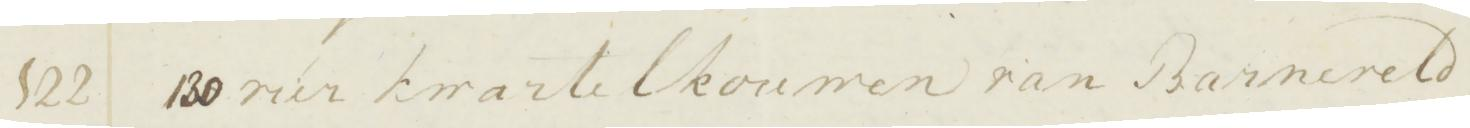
122 130 vier kwartelkouwen van Barneveld
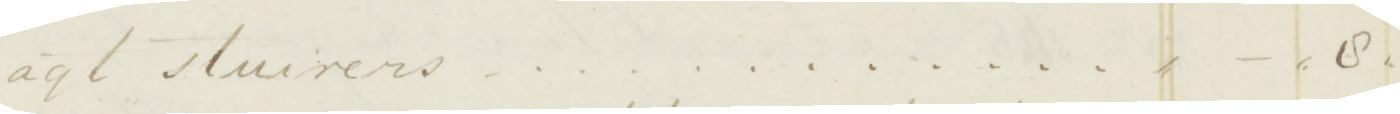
agt stuivers . . . . . . . . . . . . „ — „ 8„
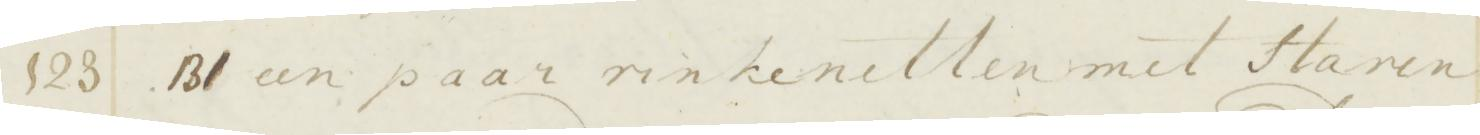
123 131 een paar vinkenetten met staven
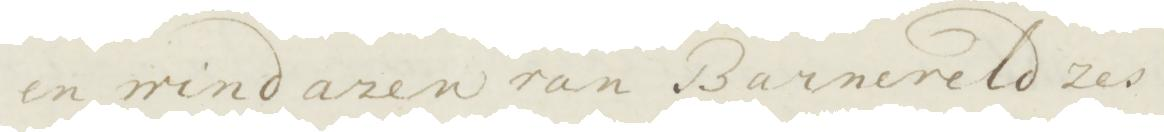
en wind aren van Barneveld zes
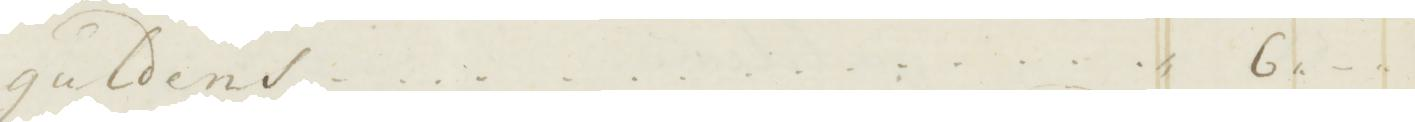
guldens . . . . . . . . . . . . . . . „ 6„ — „
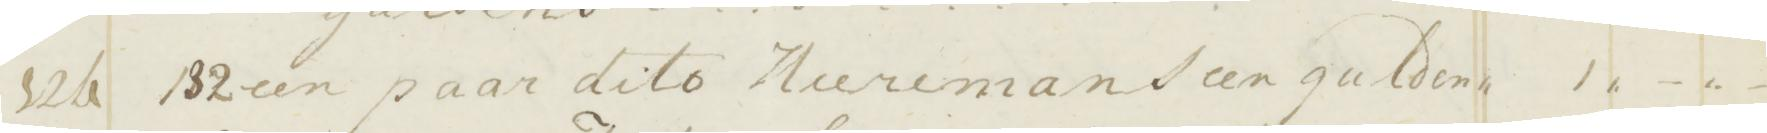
124 132 een paar dito Heeremans een gulden„ 1„ — „
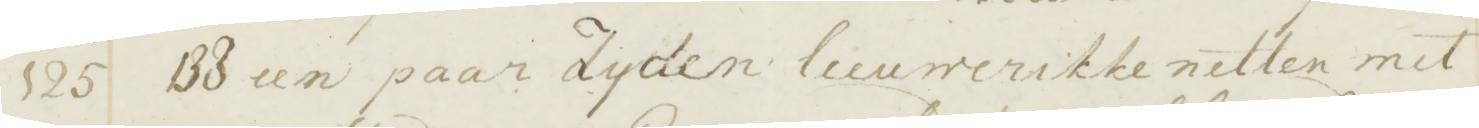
125 133 een paar Zyden leeuwerikke netten met
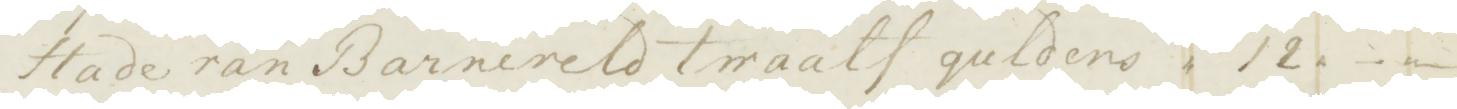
stade van Barneveld twaalf guldens „ 12 „ — „
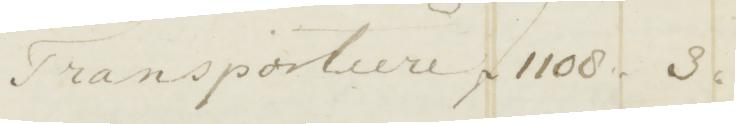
Transporteere ƒ 1108„ 3„
